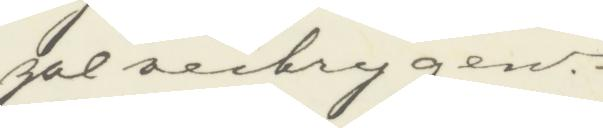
zal verkrygen.
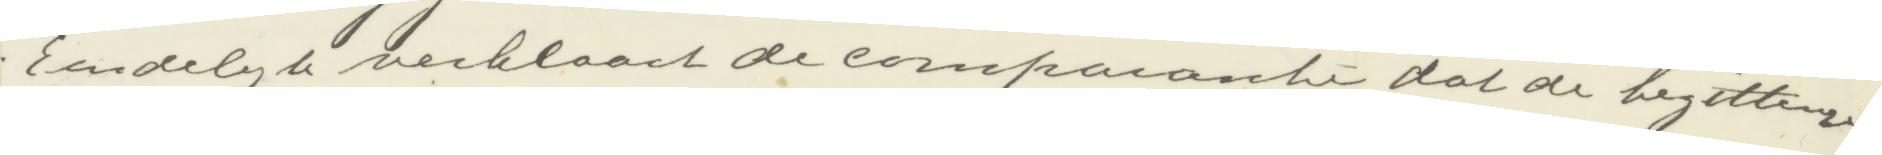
Eindelyk verklaart de comparante dat de bezittingen
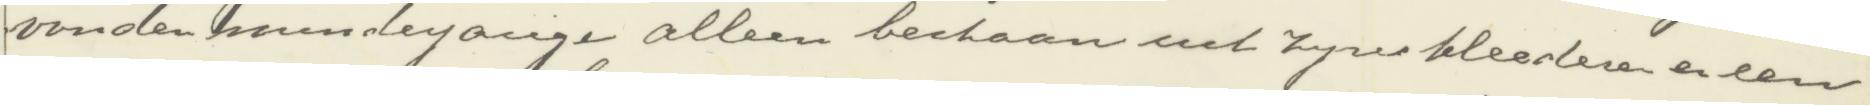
van den minderjarige alleen bestaan uit zyn kleederen en een
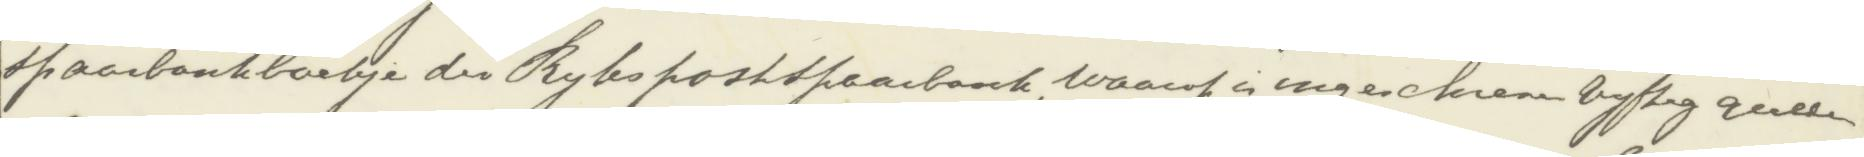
spaarbankboekje des Rykspostspaarbank, waarop is ingeschreven vyftig gulden
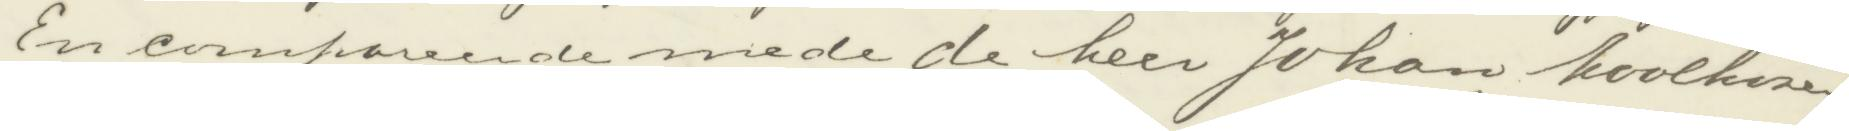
En compareerde mede de heer Johan koolhoven
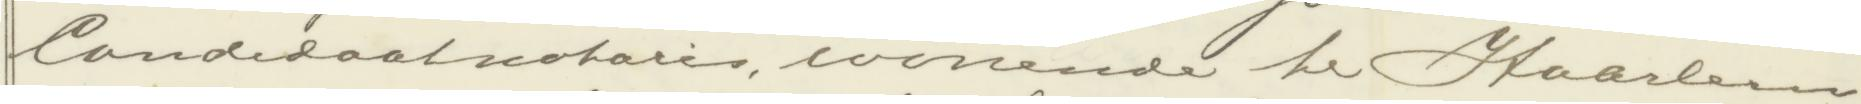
Candidaatnotaris, wonende te Haarlem
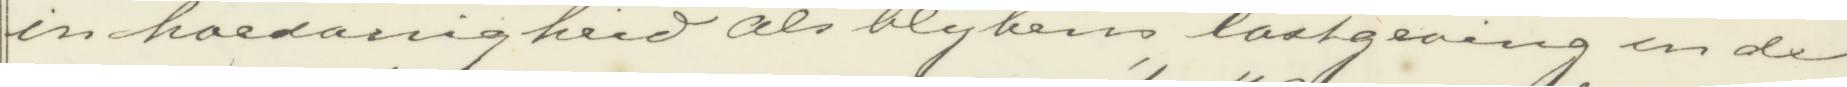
in hoedanigheid als blykens lastgeving in de
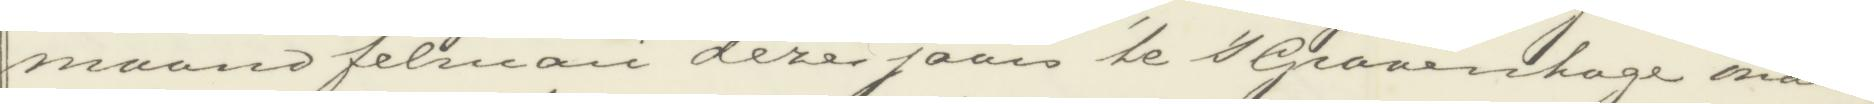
maand februari dezes jaars te 's Gravenhage onder
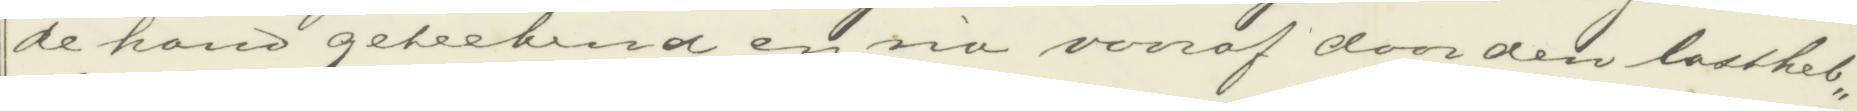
de hand geteekend en nà vooraf door den lastheb„
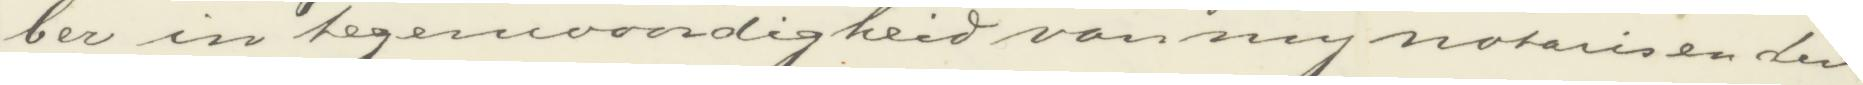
ber in tegenwoordigheid van my notaris en der
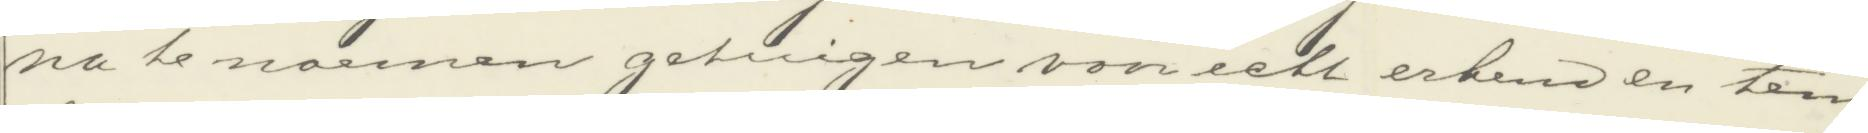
na te noemen getuigen voor echt erkend en ten
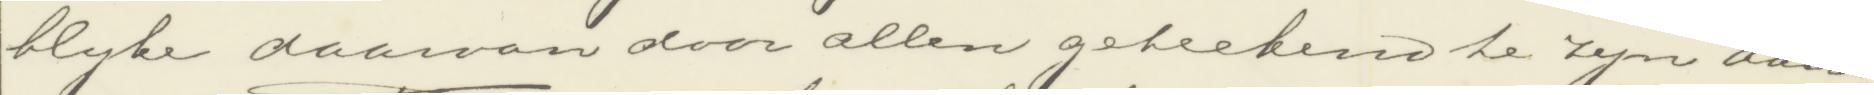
blyke daarvan door allen geteekend te zyn aan
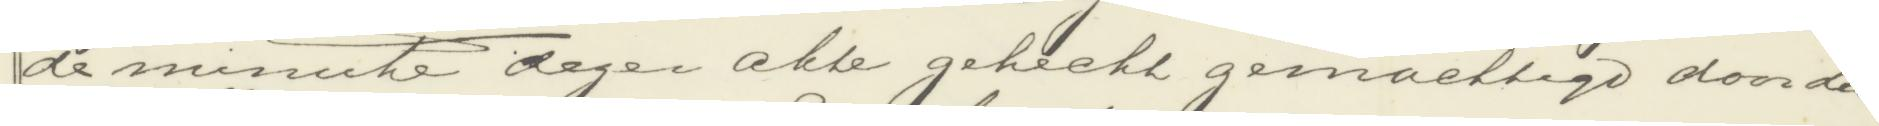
de minute dezer akte gehecht gemachtigd door den
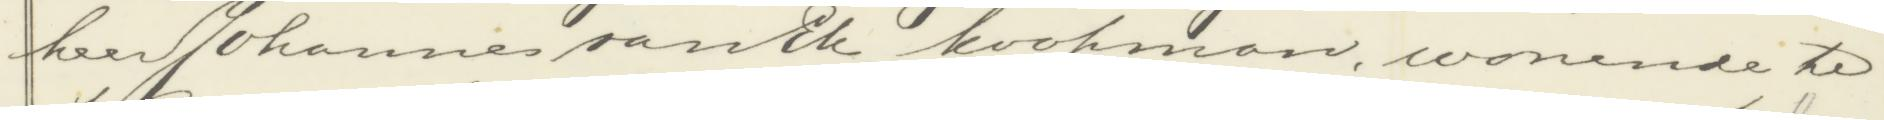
heer Johannes van Ek, koopman, wonende te
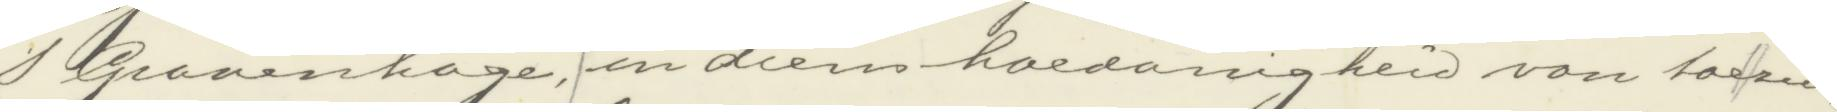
's Gravenhage,| in diens hoedanigheid van toe||zien
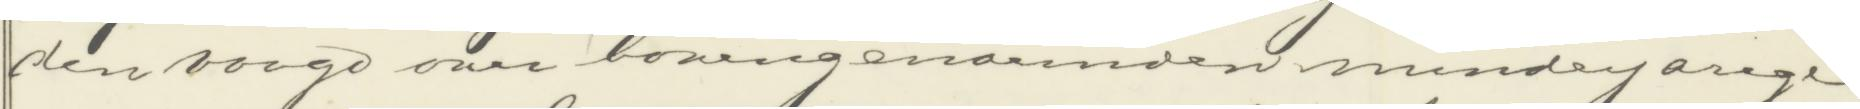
den voogd over bovengenoemden minderjarige
